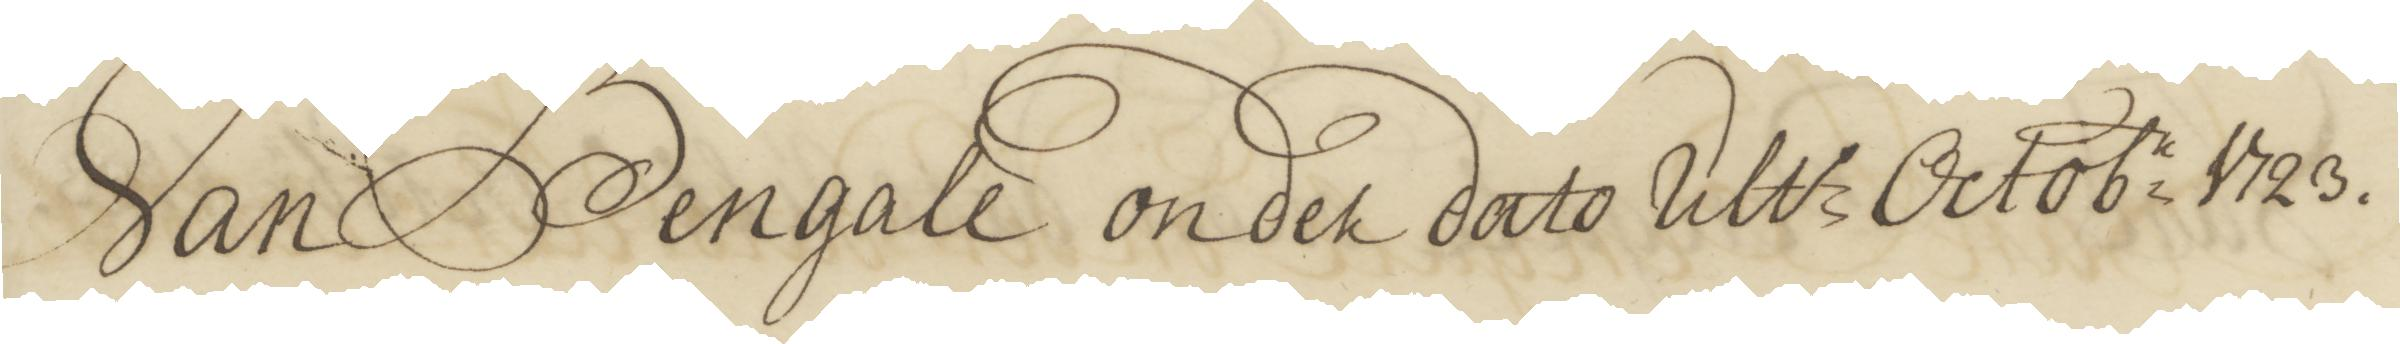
Van Bengale onder dato Vlt=o Octob„r 1723.
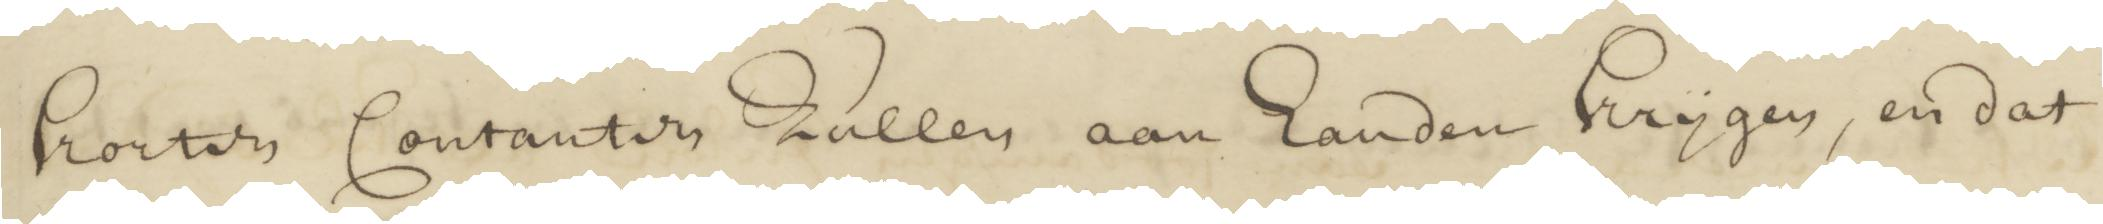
korten Contanten zullen aan handen krijgen, en dat
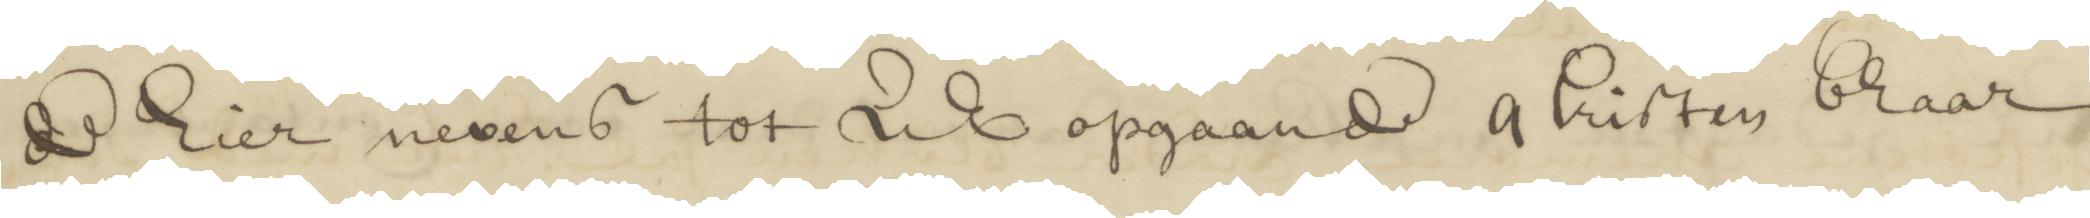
de hier nevens tot vE opgaande 4 kisten bhaar
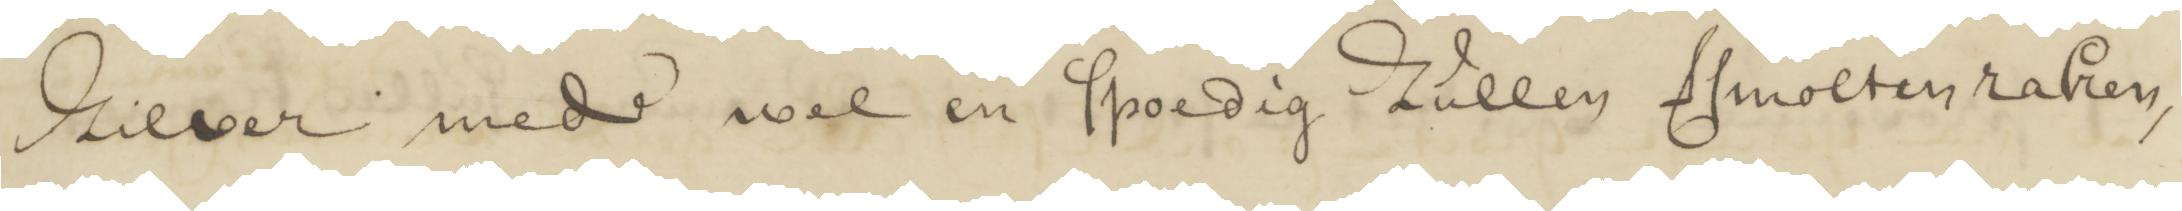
zilver mede wel en spoedig zullen versmolten raken,
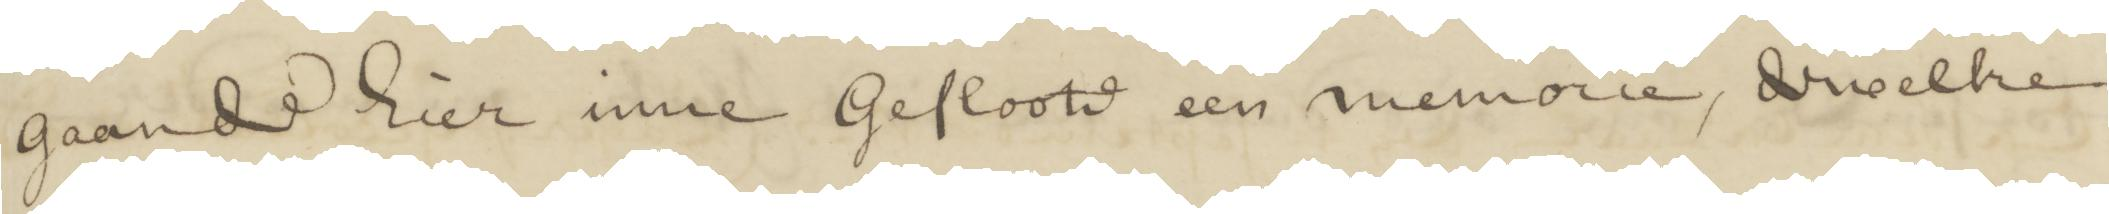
gaande hier inne Gesloote een memorie, dewelke
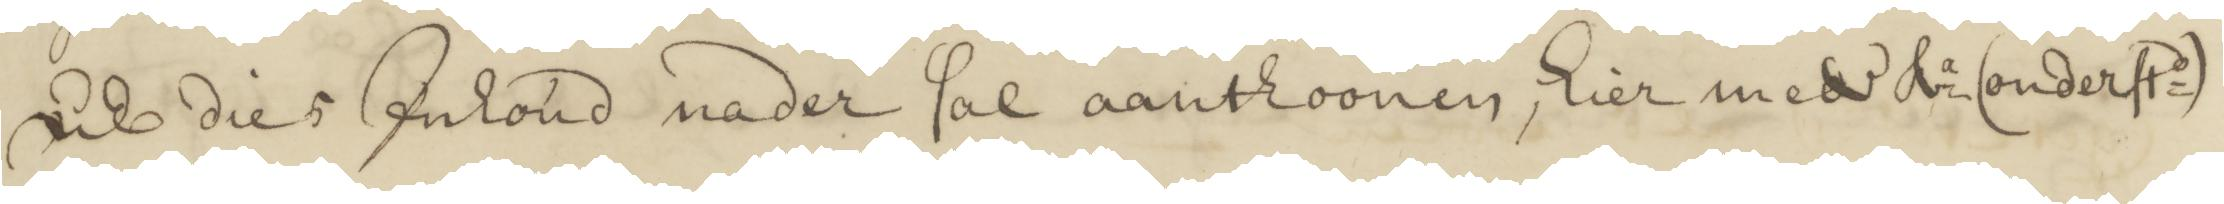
vE dies Jnhoud nader sal aanthoonen, hier mede &=a (onderst=d)
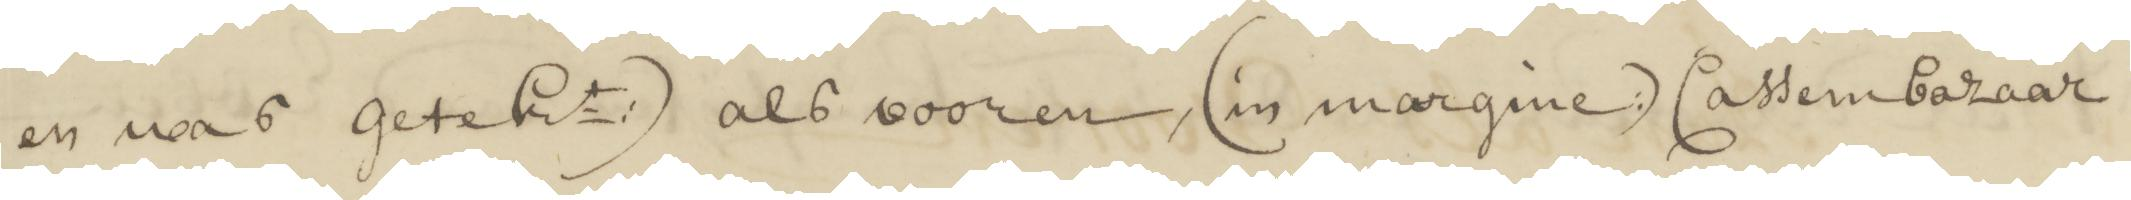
en was getek=t :) als vooren, (in margine :) Cassembazaar
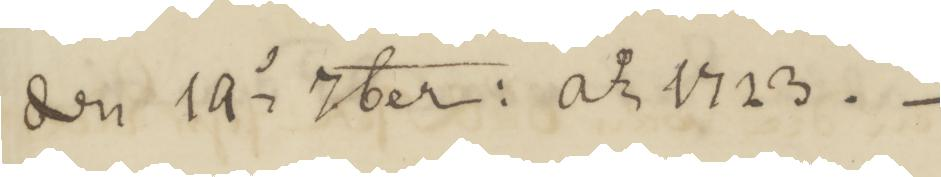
den 14=' 7ber: a=o 1723. —
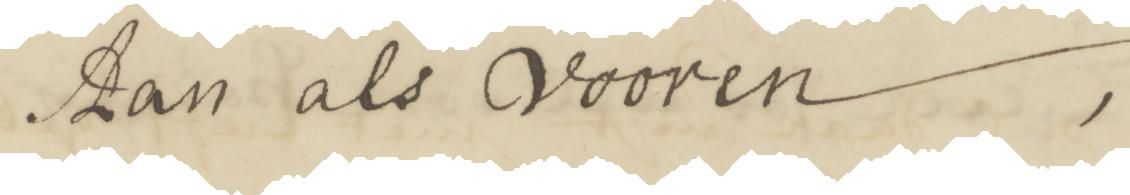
Aan als vooren,
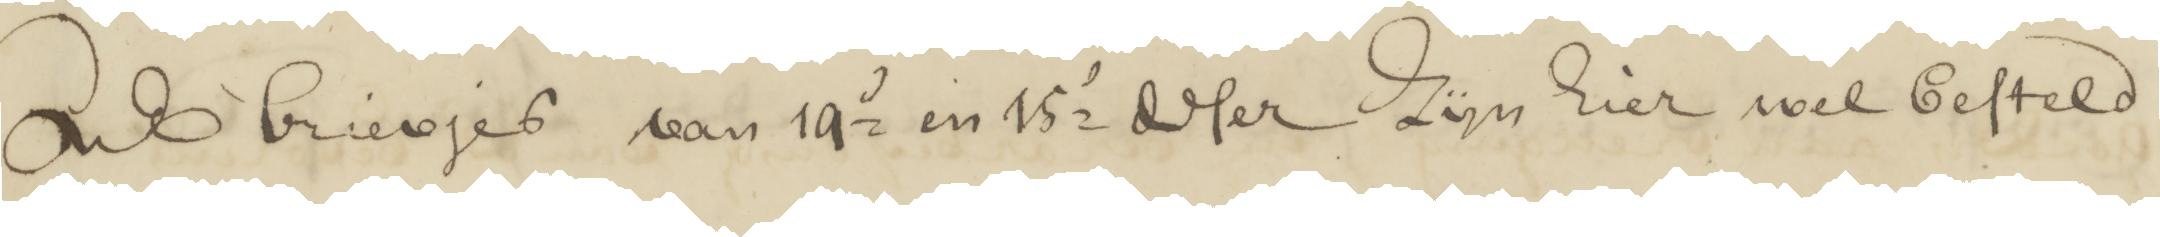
VE brievjes van 14=' en 15=' deser zijn hier wel besteld
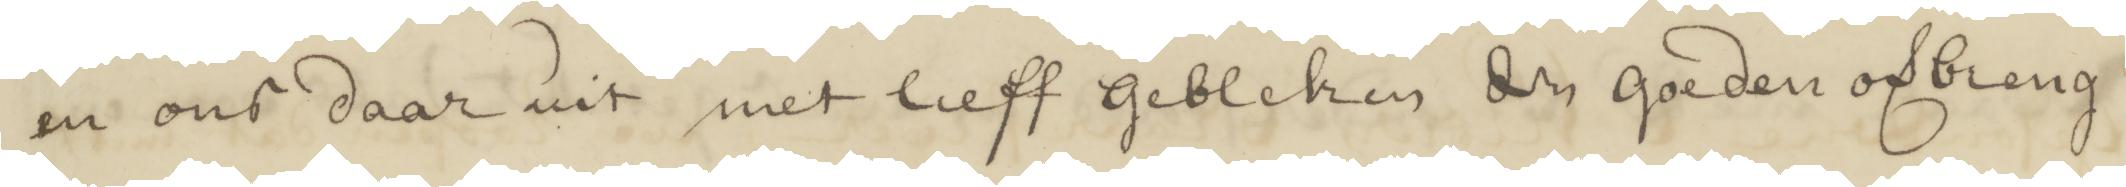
en ons daar uit met lieff gebleken den goeden overbreng
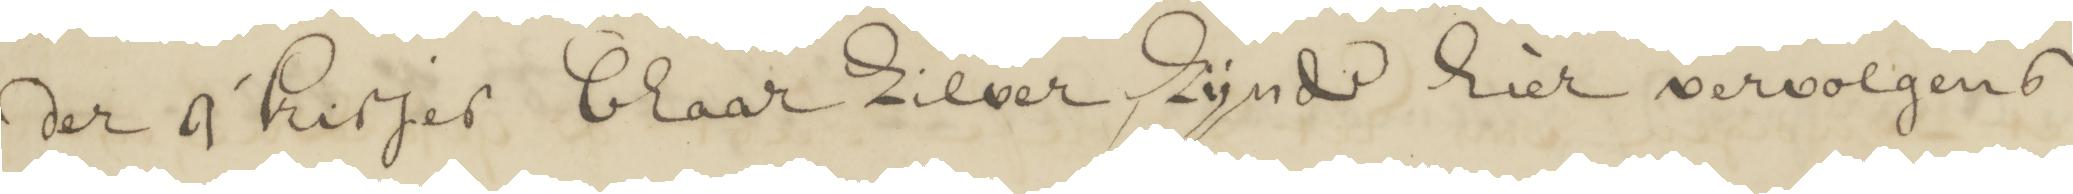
der 4’ kisjes bhaar zilver, zijnde hier vervolgens
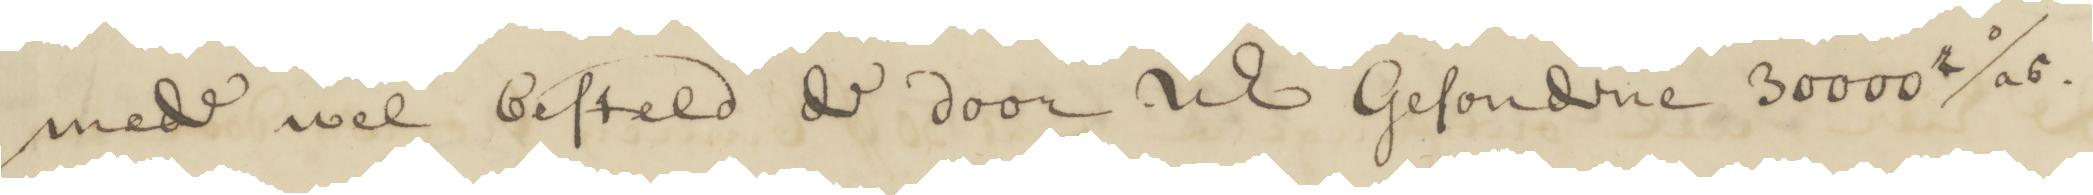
mede wel besteld de door VE Gesondene 30000 r/oas.
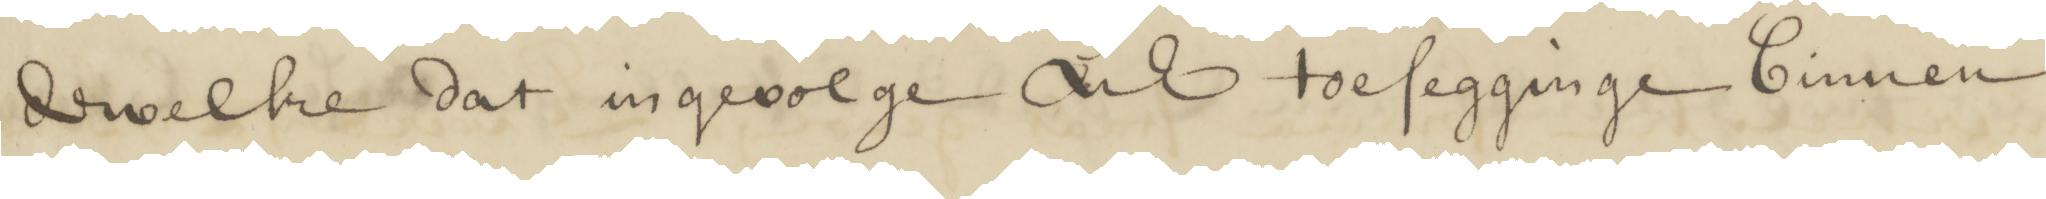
dewelke dat ingevolge VE toesegginge binnen
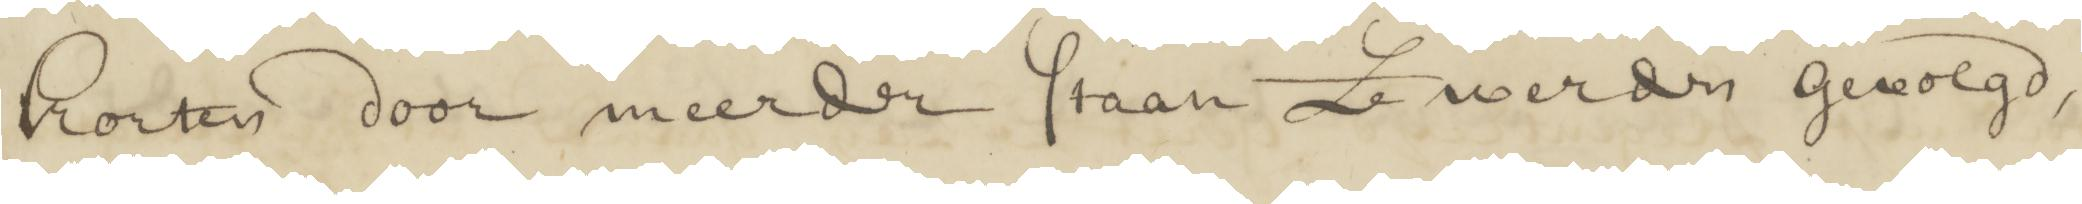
korten door meerder staan te werden gevolgd,
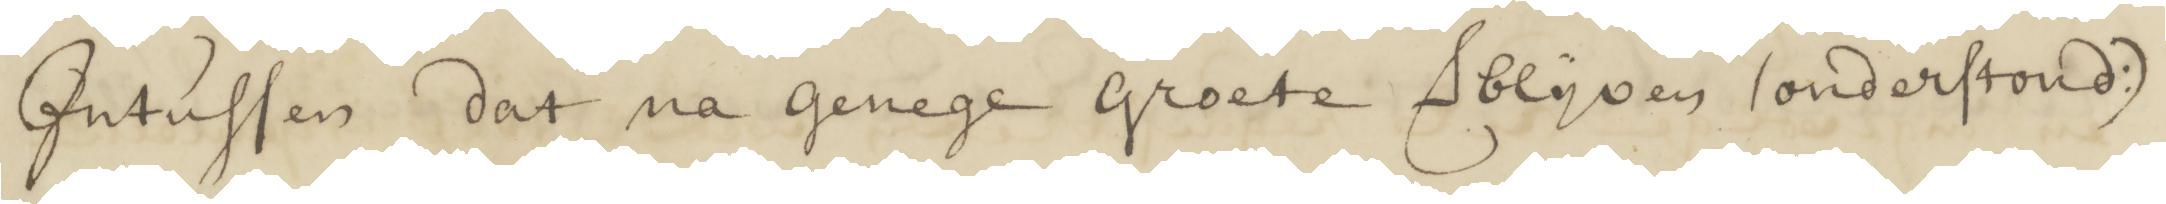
Jntussen dat na genege groete verblijven (onderstond :)
